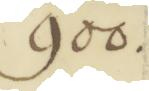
900.
